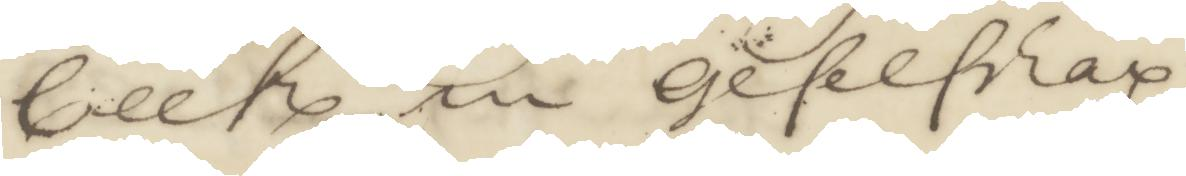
beek in geselschap
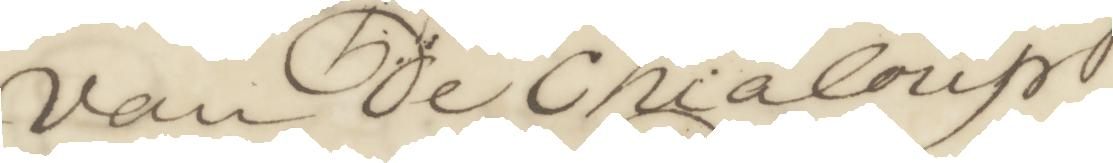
van de chialoup
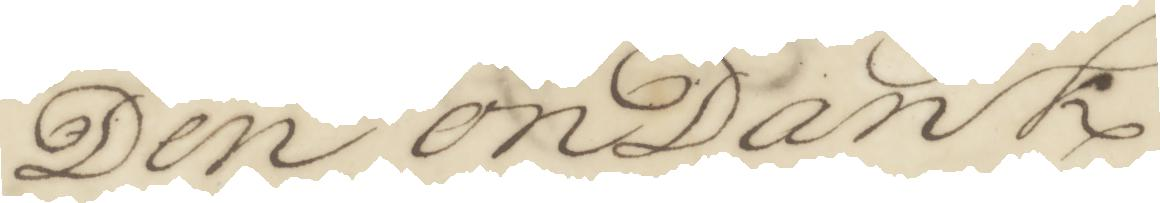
Den on Dank,
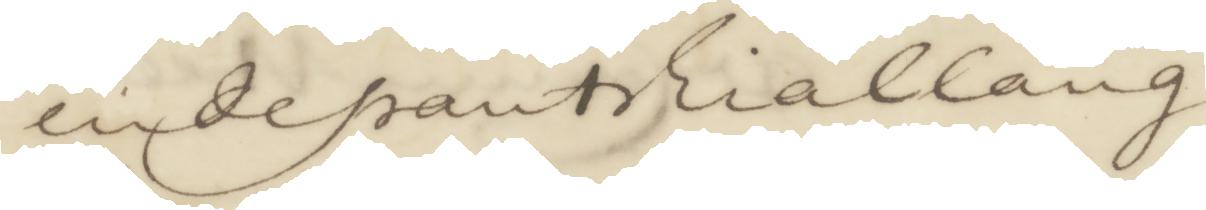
en de pantchiallang
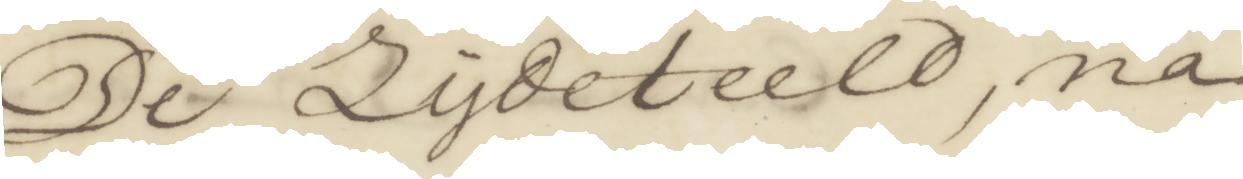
De Zijdeteeld, na
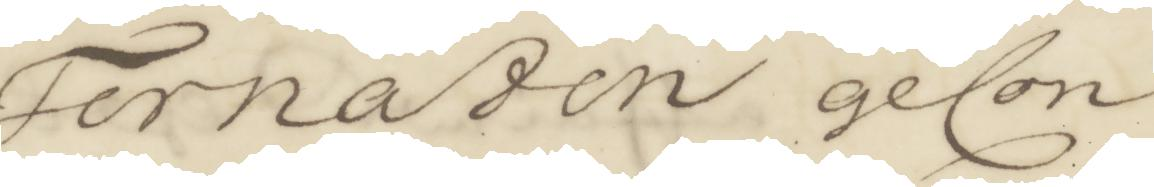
Ternaten gecon
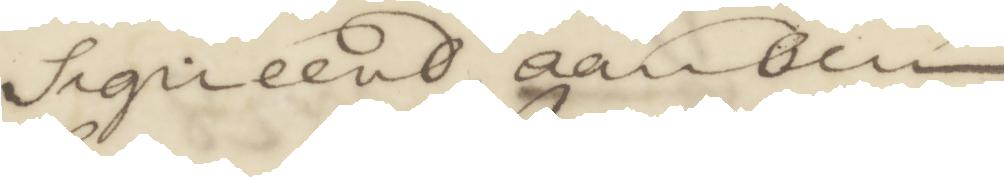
signeerd, aan den
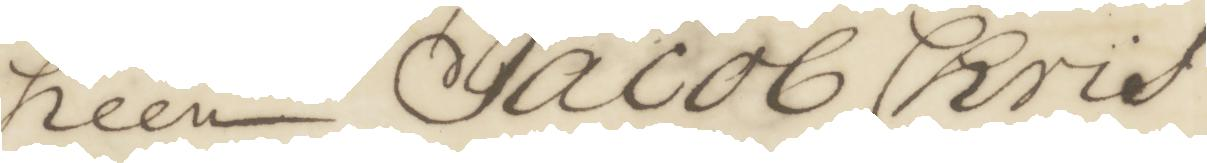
heer Jacob Chris
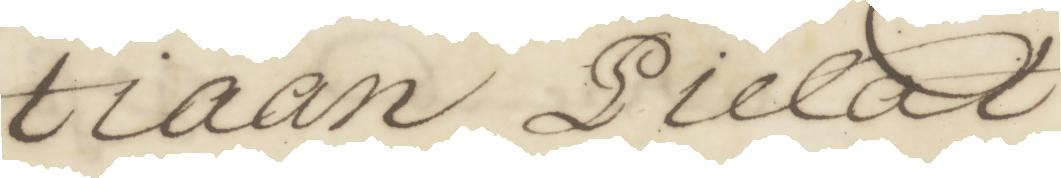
tiaan Pielat
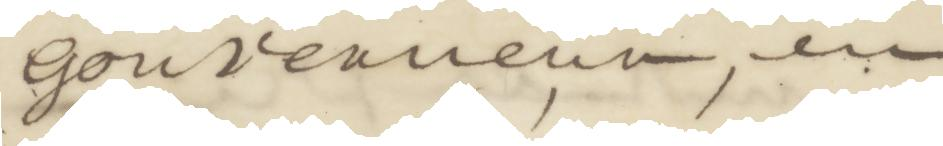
gouverneur, en
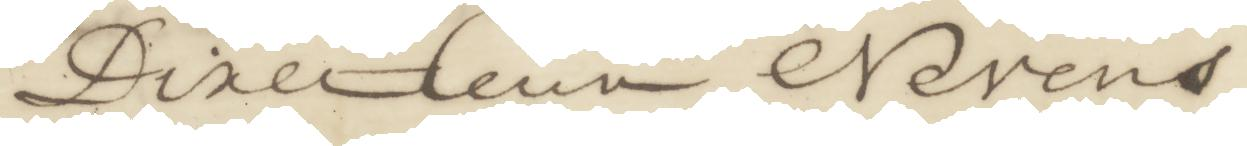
Directeur Nevens
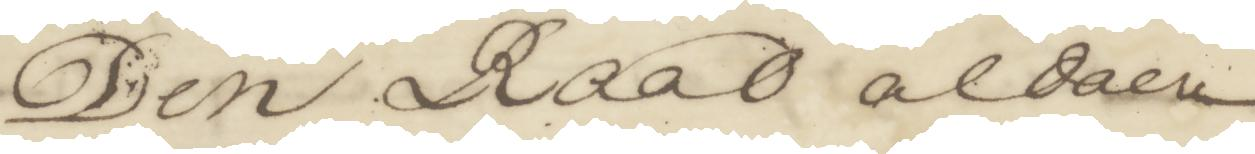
Den Raad aldaer
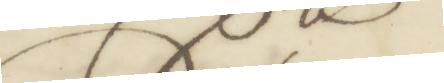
P„r
